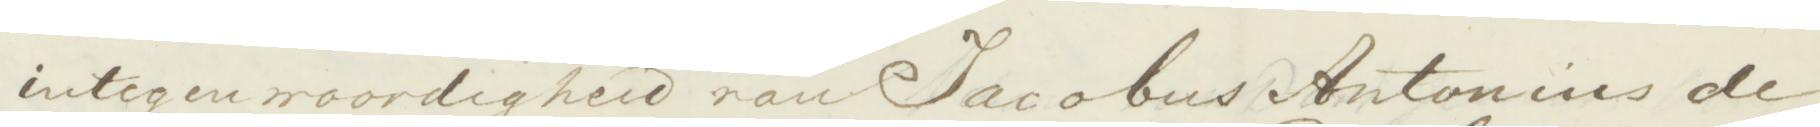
integenwoordigheid van Jacobus Antonius de
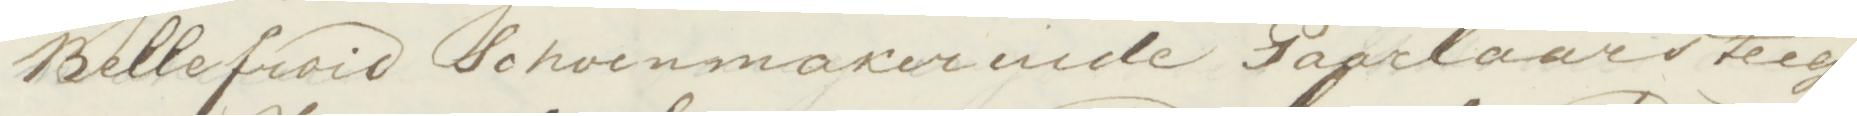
Bellefroid Schoenmaker in de Paarlaarsteeg
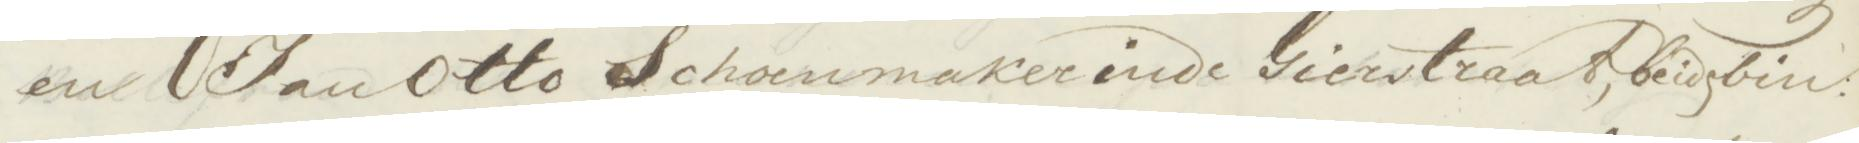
en Jan Otto Schoenmaker in de Gierstraat, beiden bin:
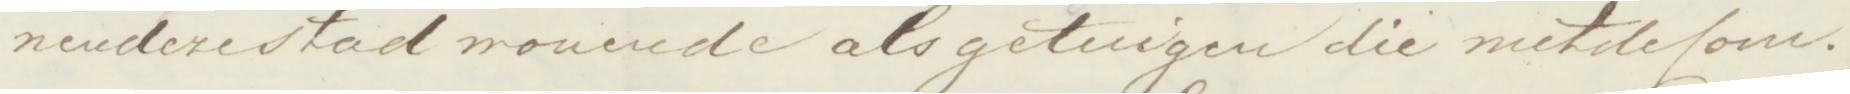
=nen deze stad wonende als getuigen die met de Com.
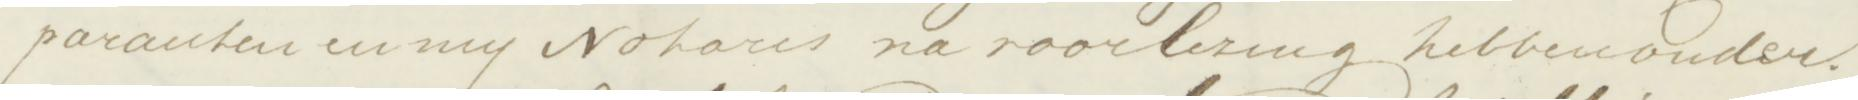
paranten en mij Notaris na voorlezing hebben onder.
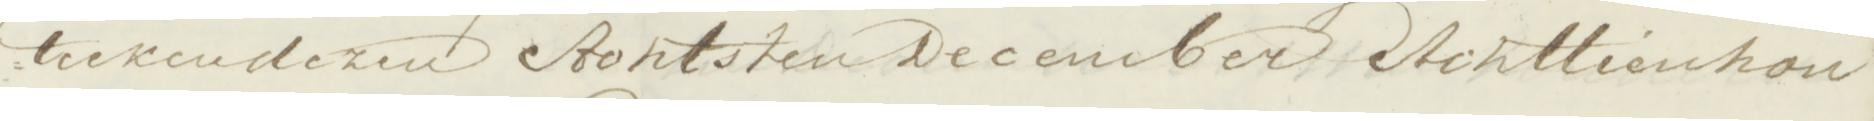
=teekendezen Achtsten December Achttienhon
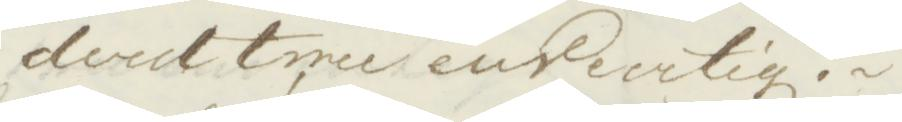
derd twee en Veertig.
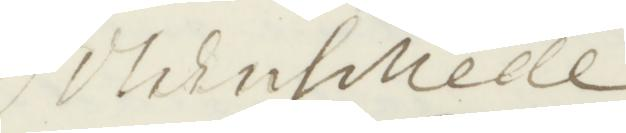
Joh Enschede
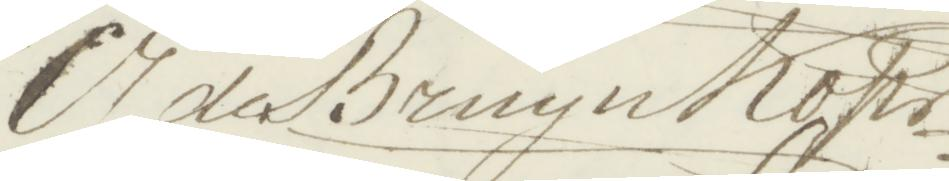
CJ de Bruyn Kops
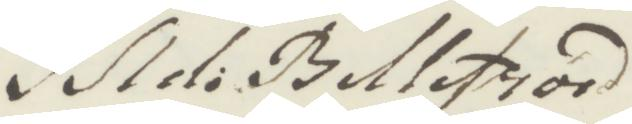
JA de Bellefroid
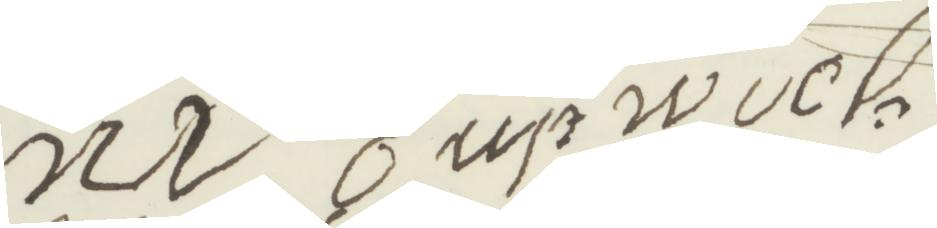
M v d Upwich.
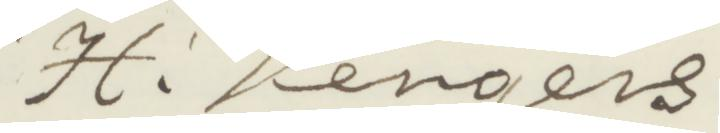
H: vergers
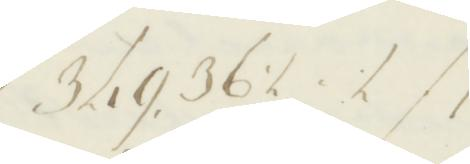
ƒ349. 36½ . ½ ƒ1.75
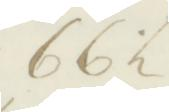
66½
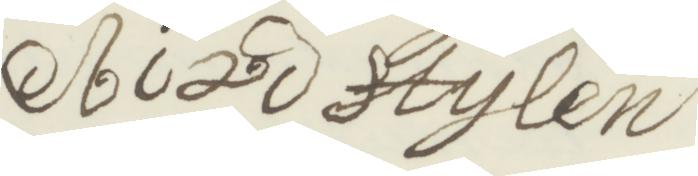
Ni vd stylen
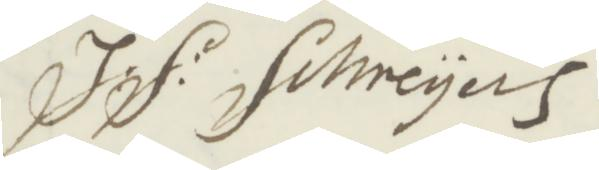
J:S: Schreijers
